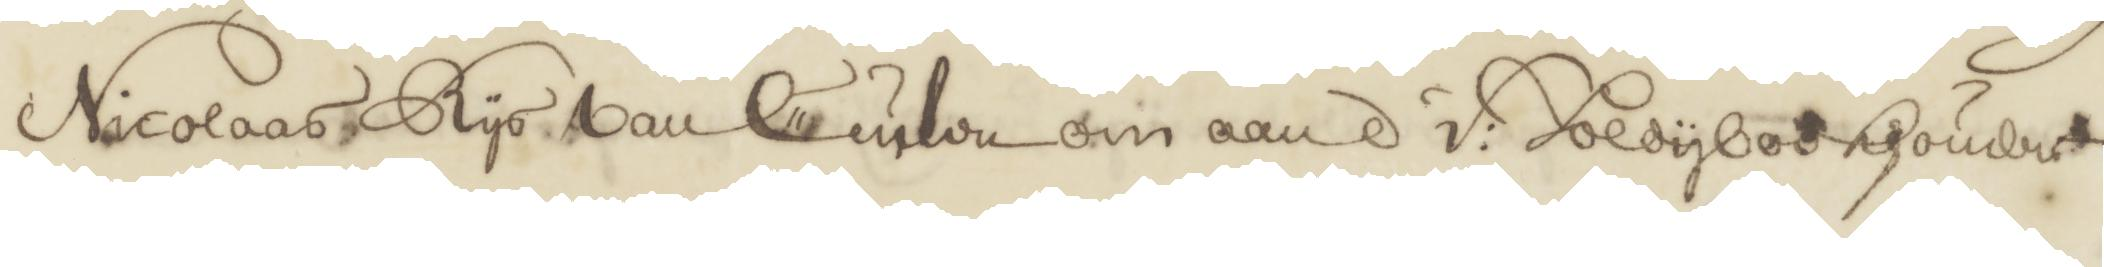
Nicolaas Rijs van Ceulen om aan d’E: soldijboekhouder
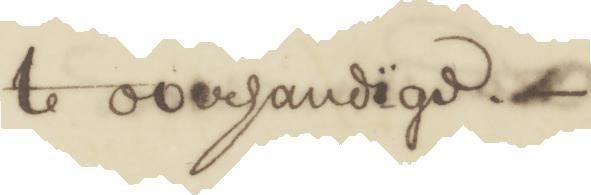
te overhandige. —
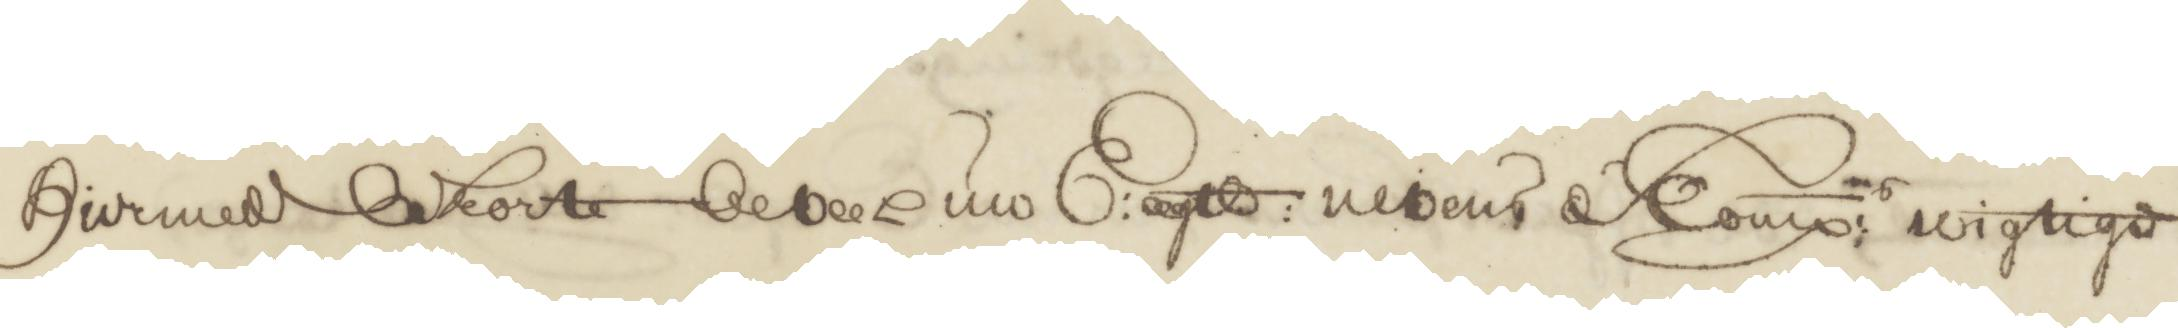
Hiermede bekorte beveel uw E: agtb: nevens d Comp:s wigtige
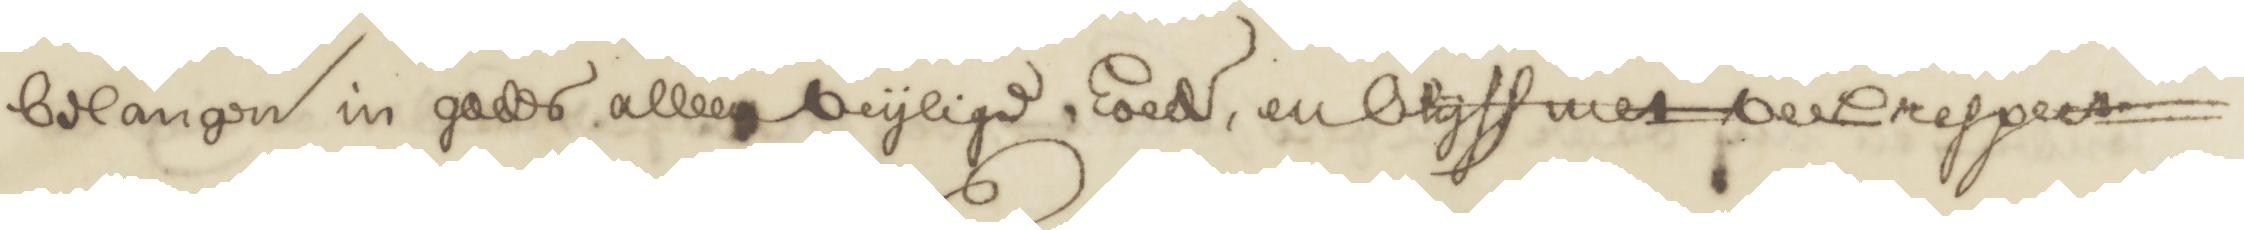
belangen in godes alleen veijlige hoede, en blijff met veel respect
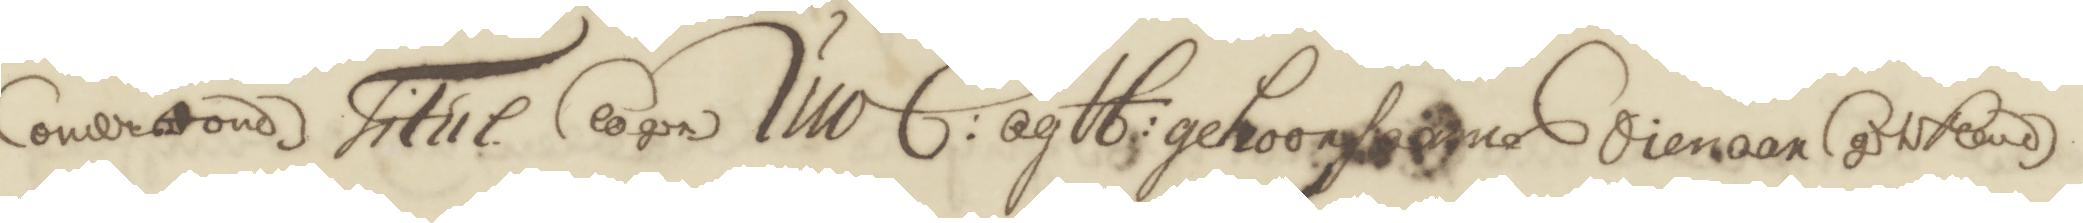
onderstond) Titul (lager) UW E: agtb: gehoorsaame dienaar (getekend)
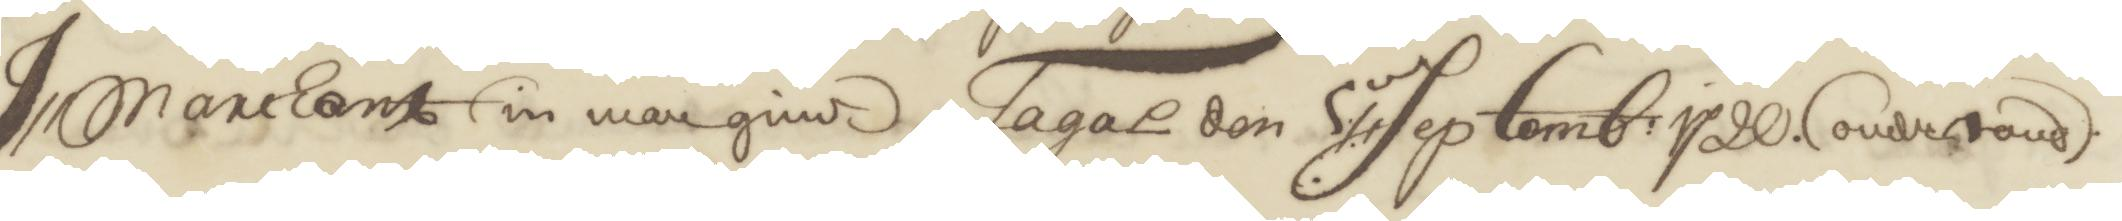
J„ marchant (in margine) Tagal den 5„e Septemb: 1720. (onderstond).
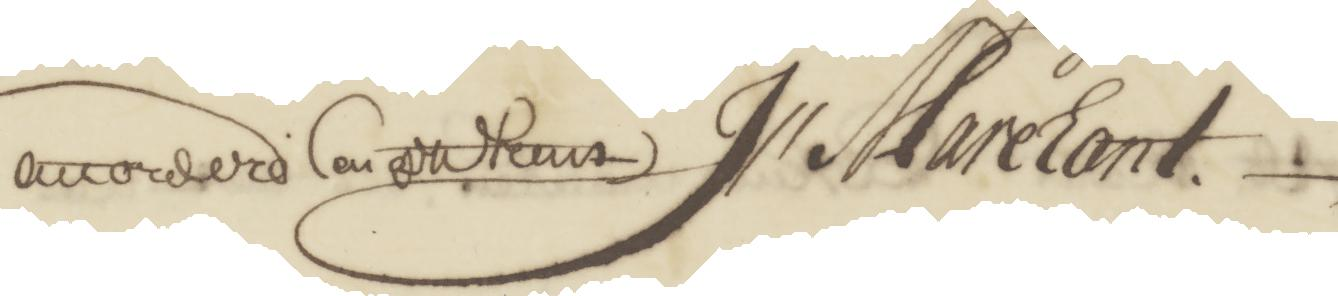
accordeerd (en getekent) J„ Marchant. —
